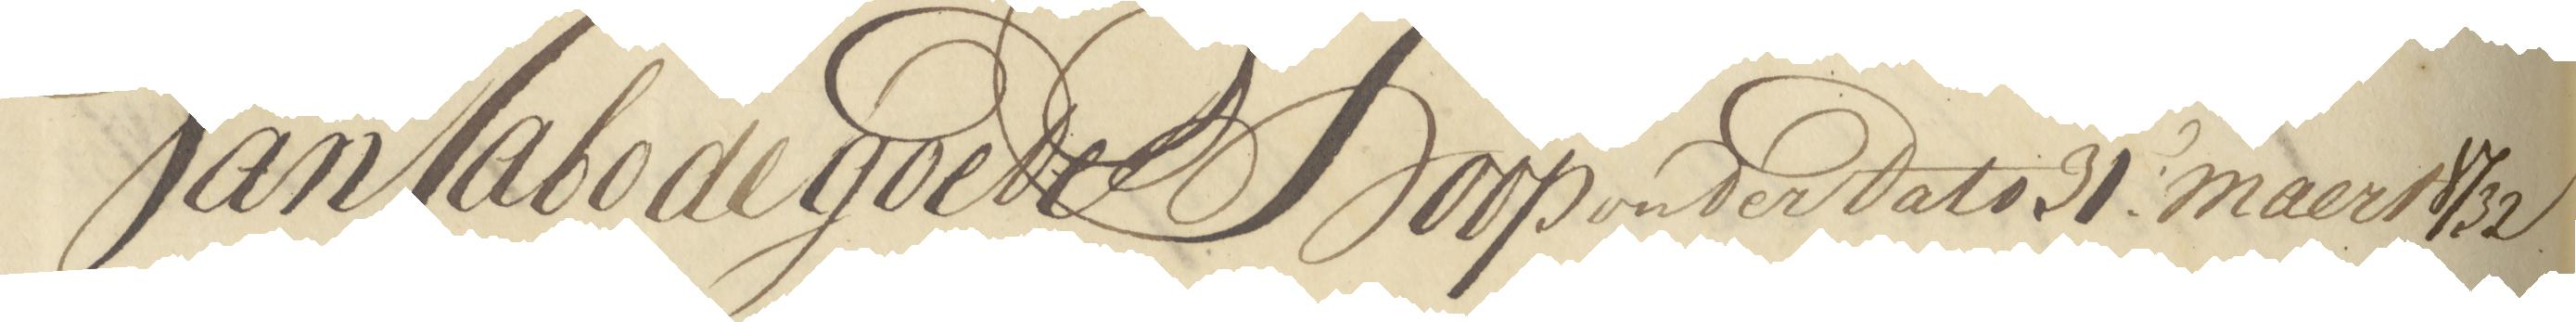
Van Cabo de goede Hoop onder dato 31:' maert 1732
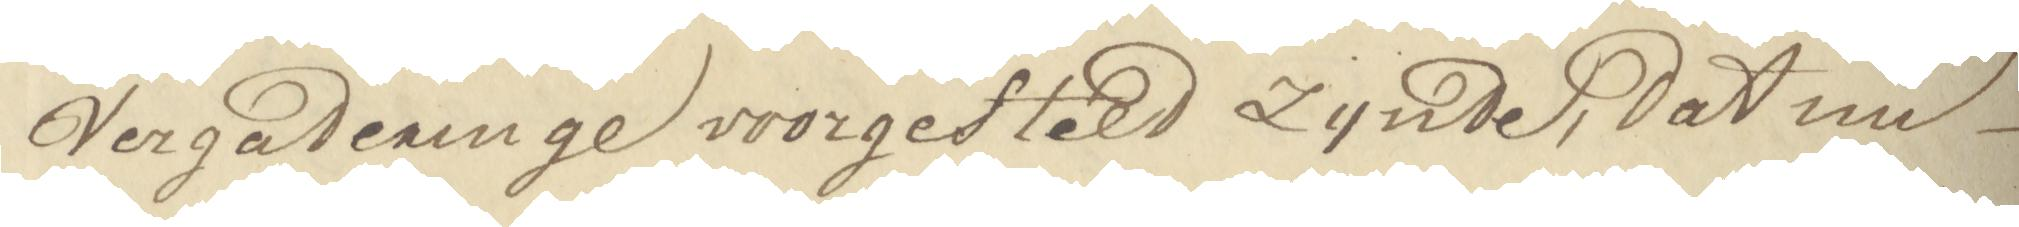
vergaderinge voorgesteld zijnde, dat nu —
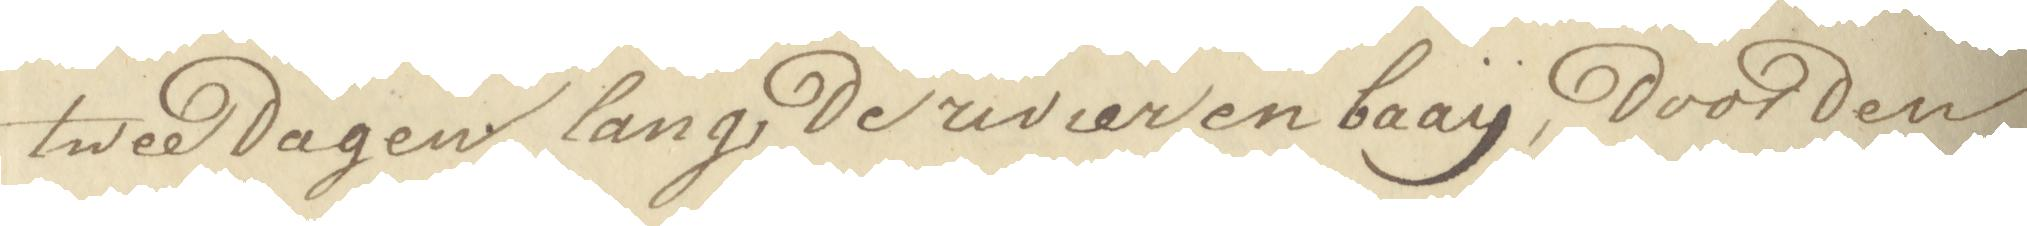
twee dagen lang de rivier en baaij, door den
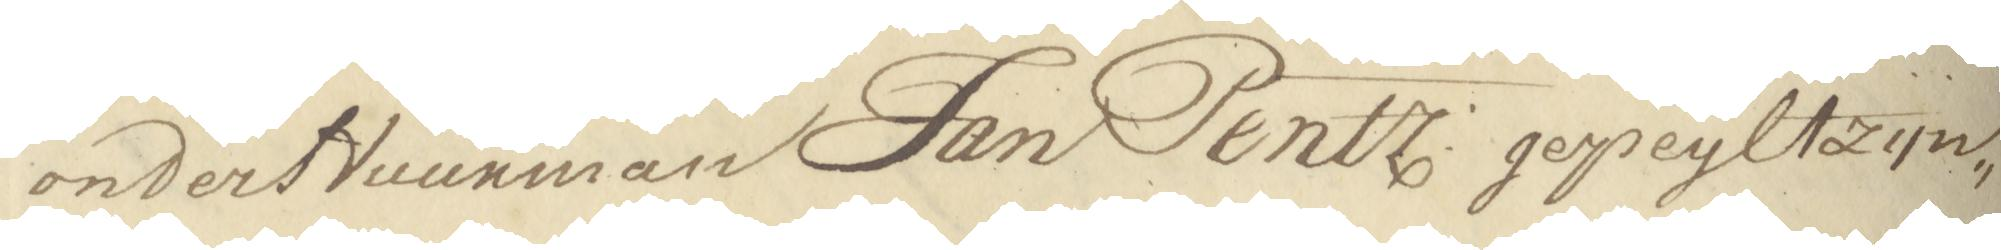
onderstuurman Ian Pentz: gepeijlt zijn„
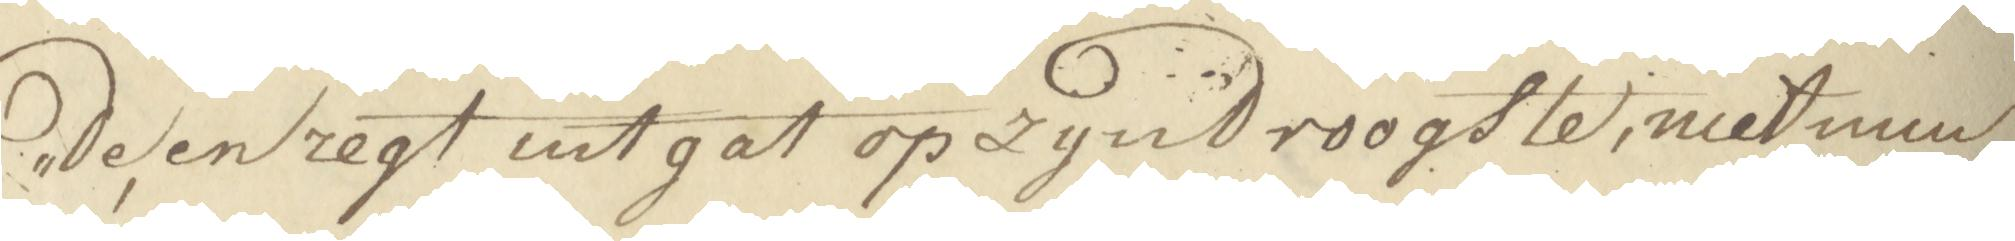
„de, en regt in't gat op zijn droogste, niet min
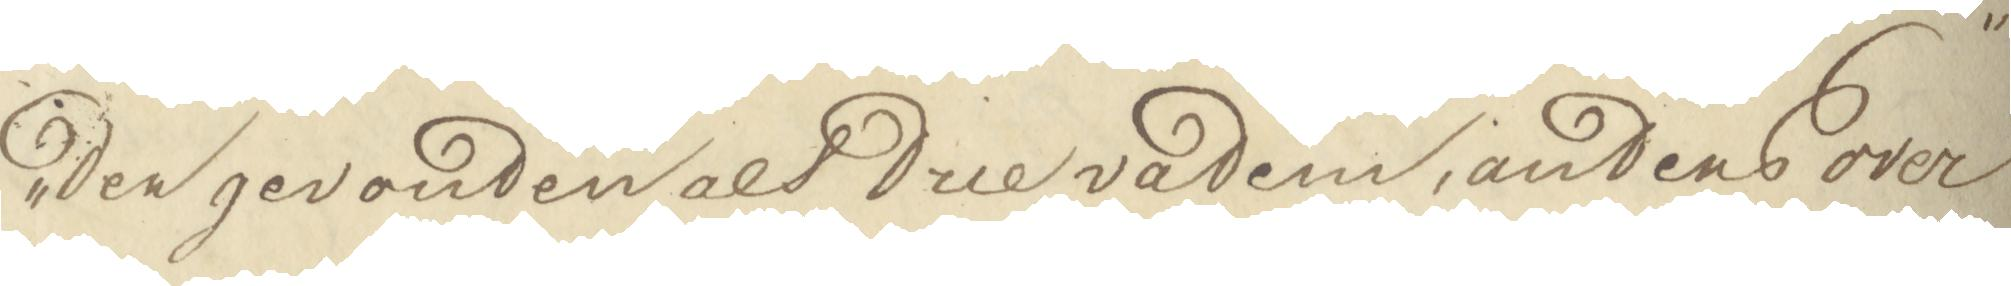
„der gevonden als drie vadem, anders over
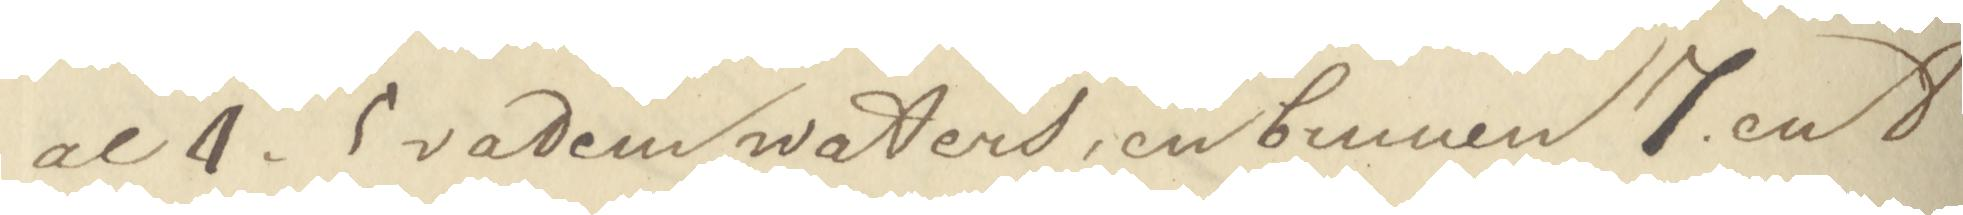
al 4 - 5 vadem waters, en binnen 7. en 8
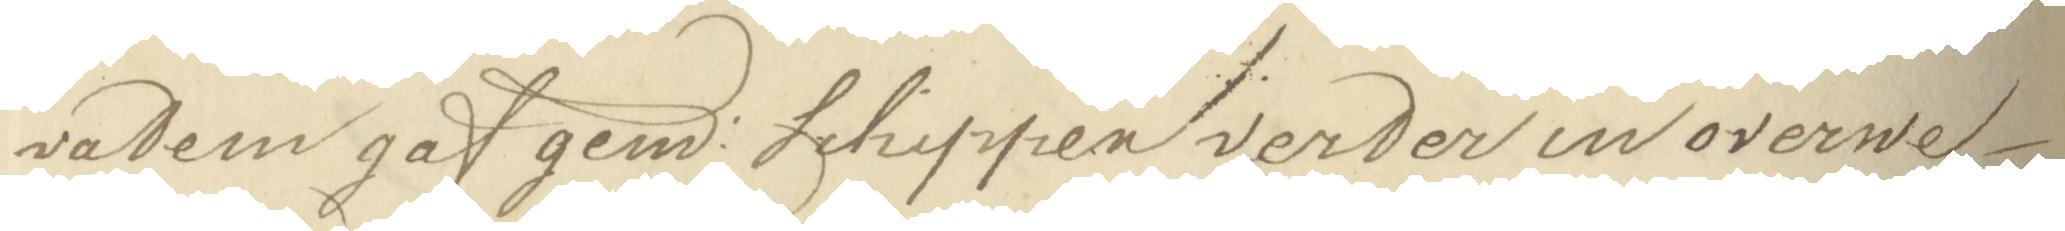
vadem gaf gem: schippen verder in overwe„
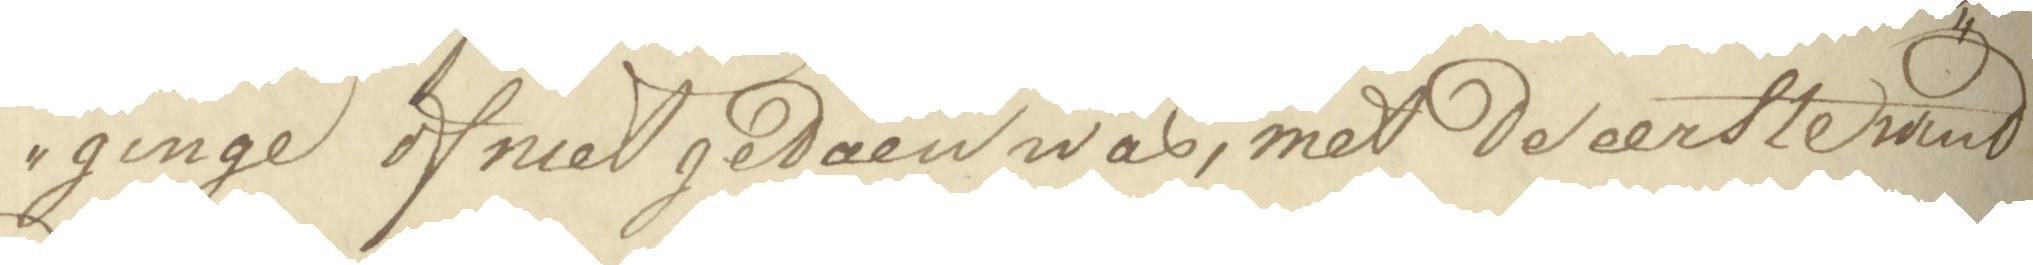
„ginge of niet gedaen was, met de eerste wind
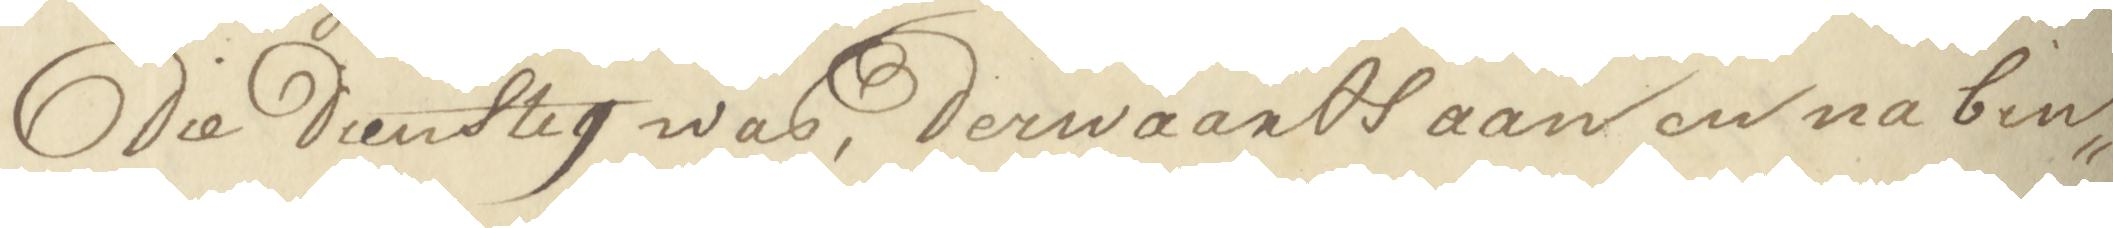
die dienstig was, derwaarts aan en na bin„
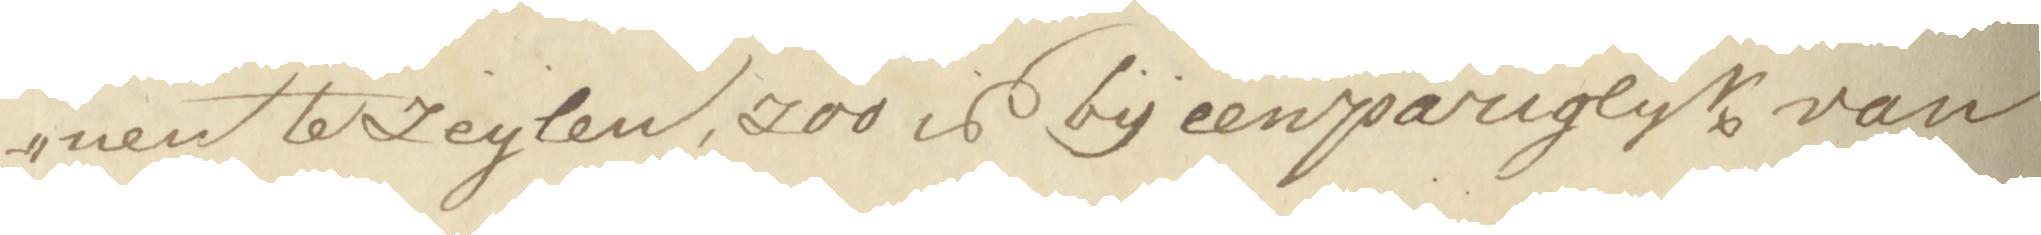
„nen te zeijlen, zoo is bij eenpariglijk van
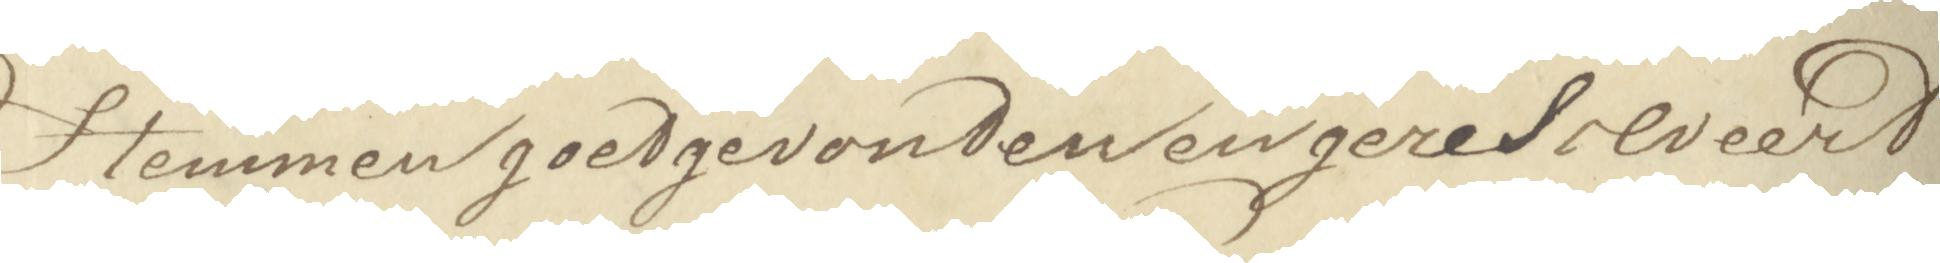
stemmen goedgevonden en geresolveerd
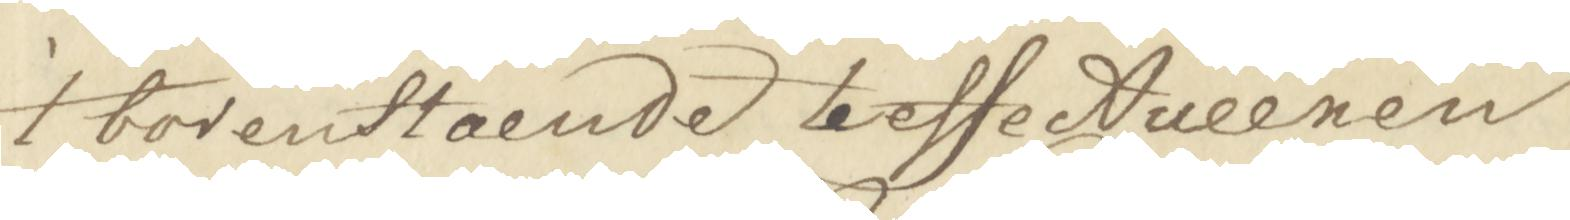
’t bovenstaende te effectueeren
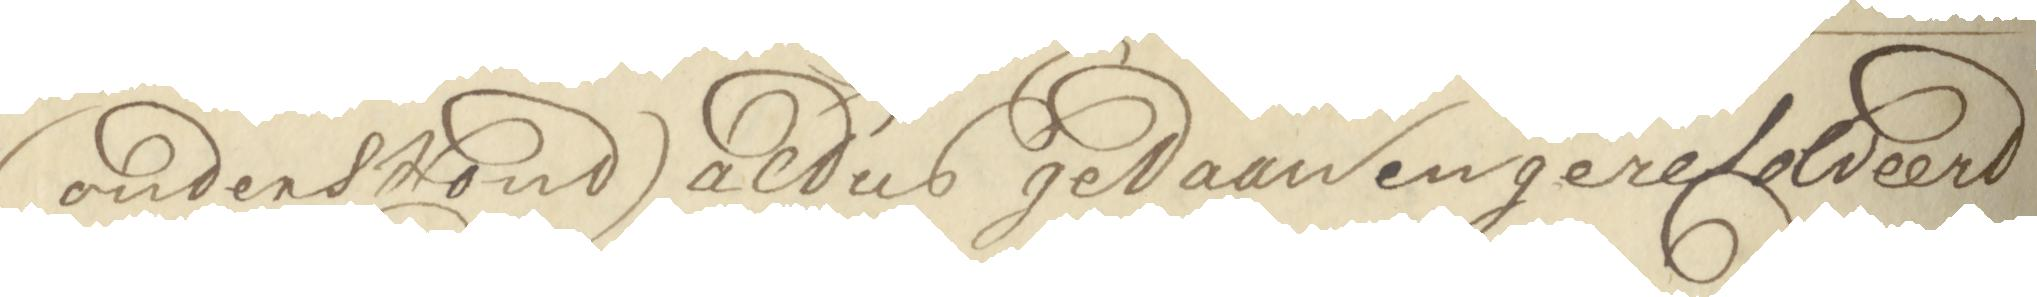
onderstond) aldus gedaan en geresolveerd
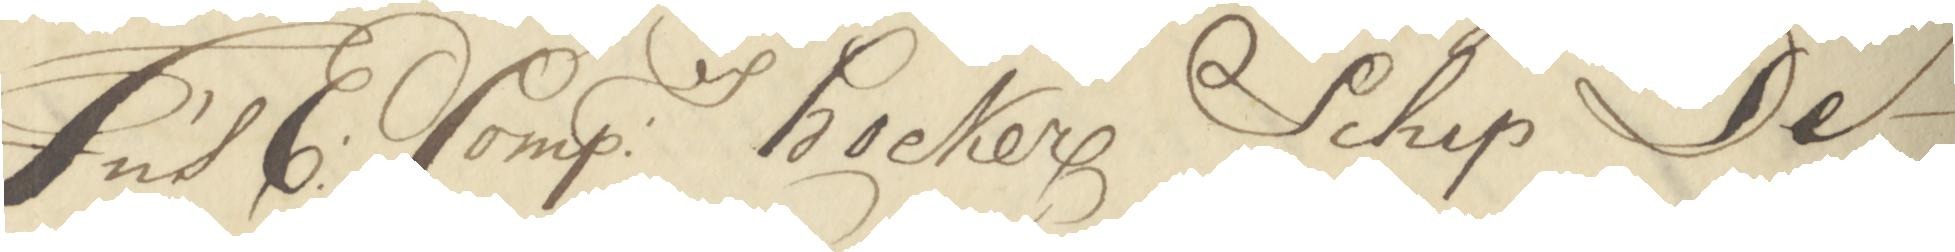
In's E: Comp:s hoeker Schip De —
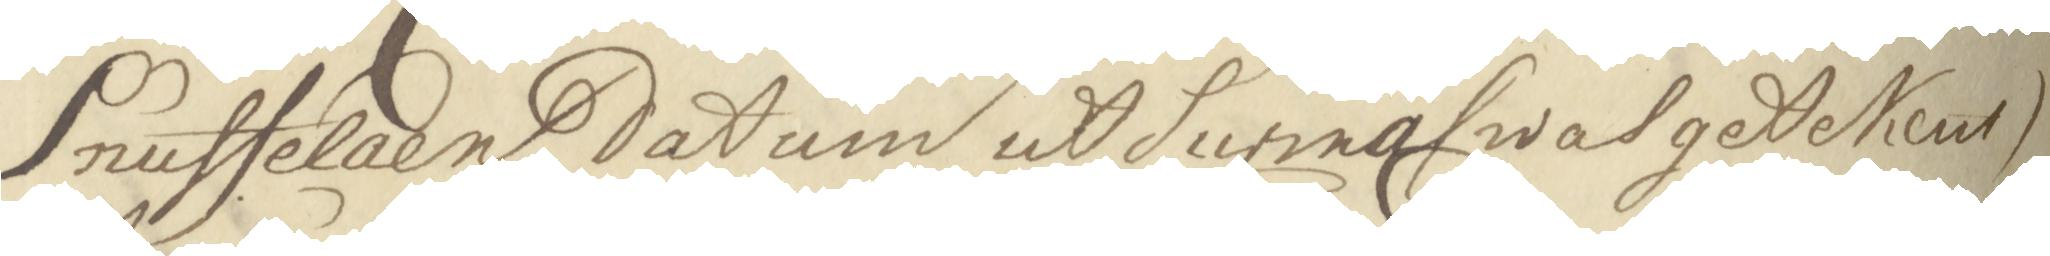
Snuffelaer datum ut supras (was getekent)
